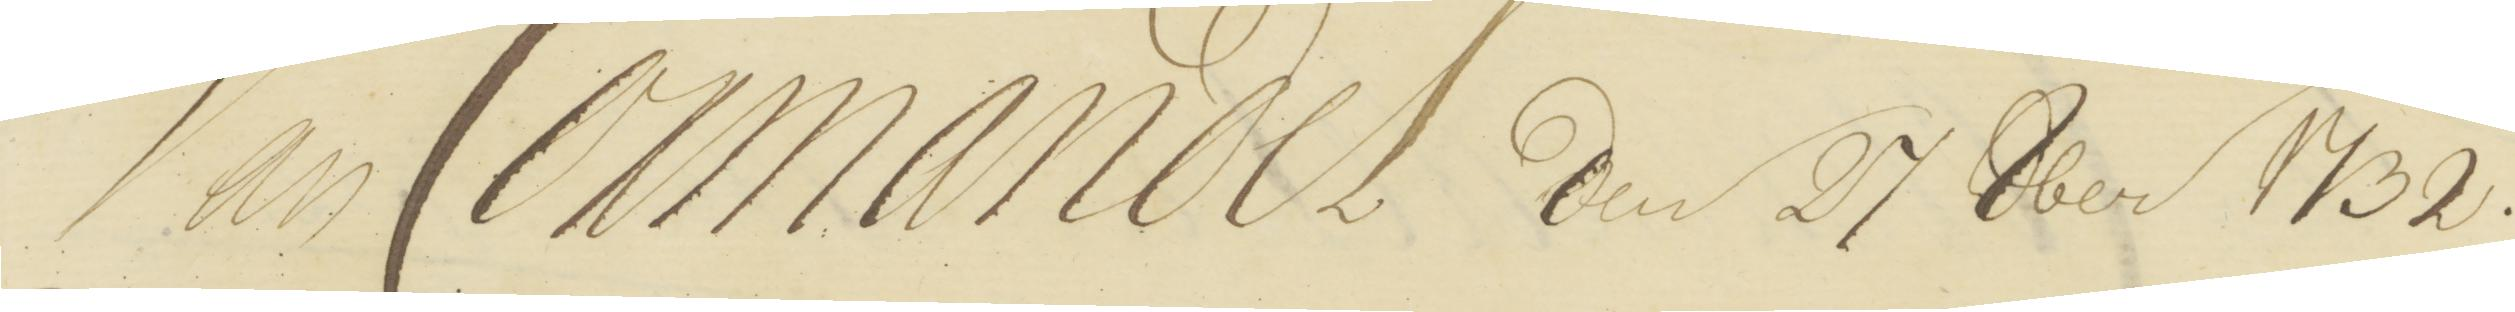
Van Cormandel den 27 8ber 1732
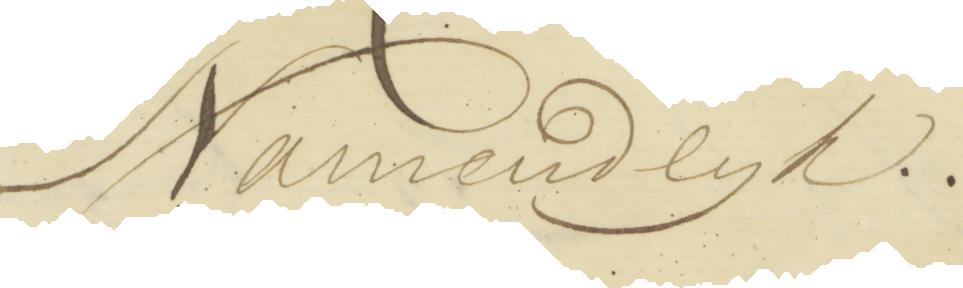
Namendlyk.
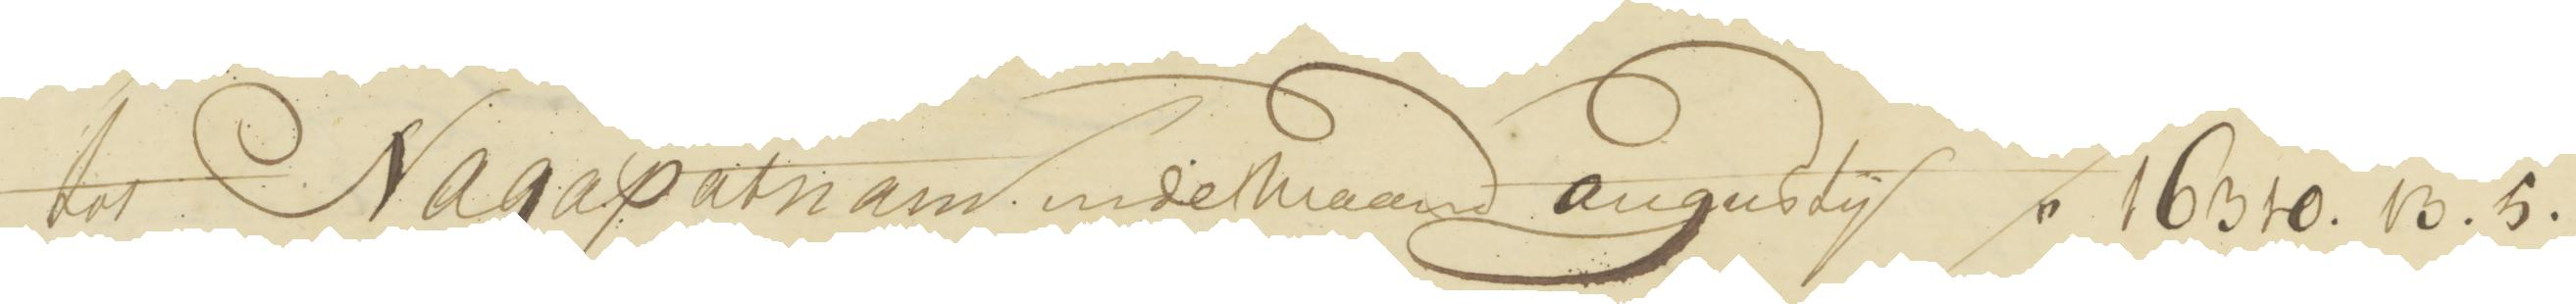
tot Nagapatnam in de maand augustij „ 16310.13.5.
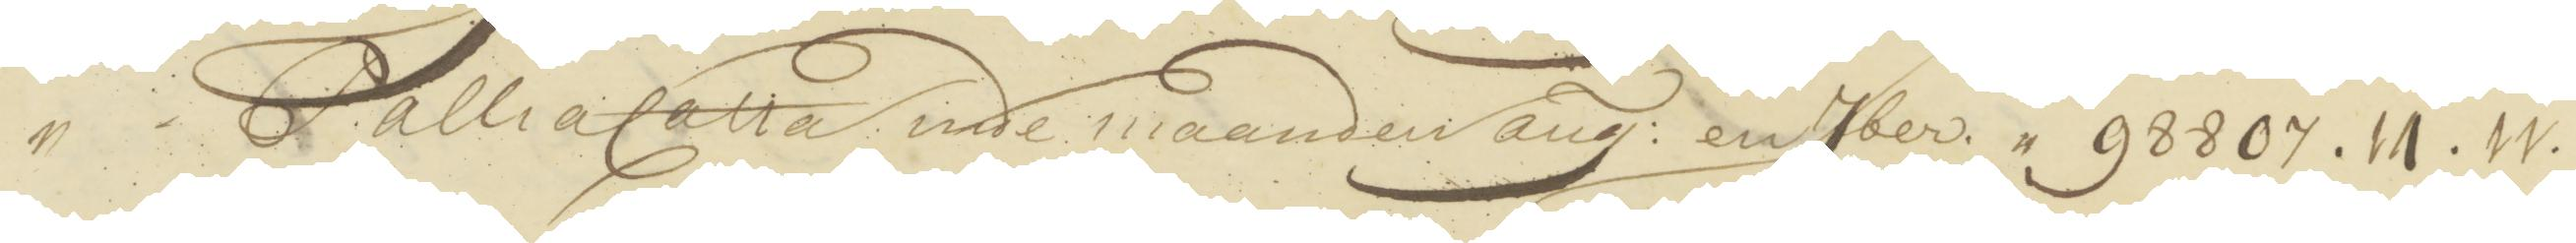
„ Palliacatta in de maanden aug: en 7ber „ 98807.14.11.
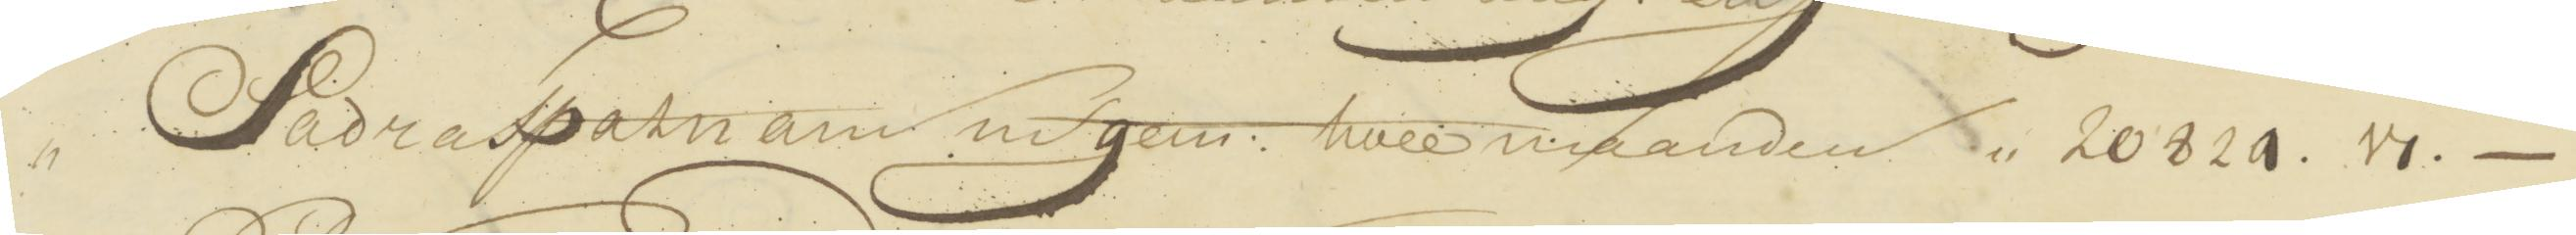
„ Sadraspatnam in gem: twee maanden „ 20824. 17. —
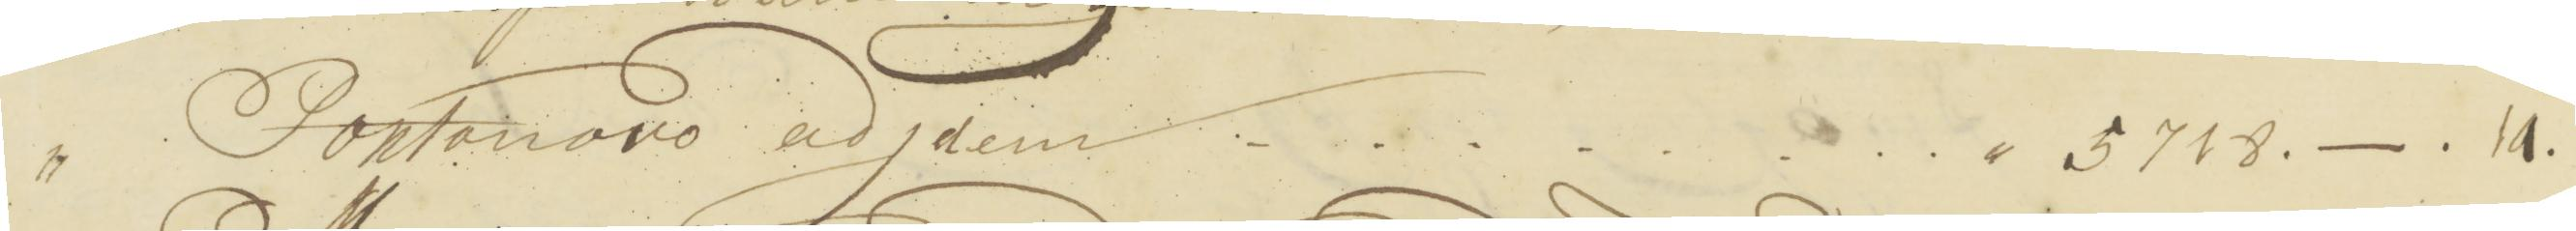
„ Portonovo ad idem - . . . . . . . „ 5718. — . 14.
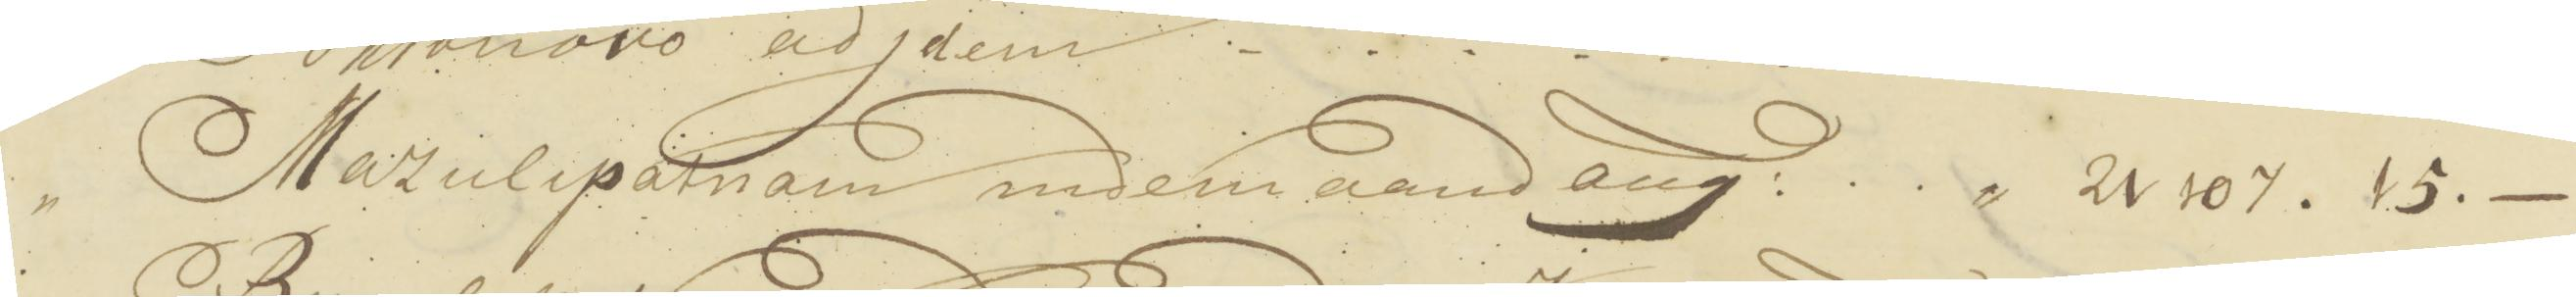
„ Mazulipatnam in de maand aug: . . „ 21107. 15. —
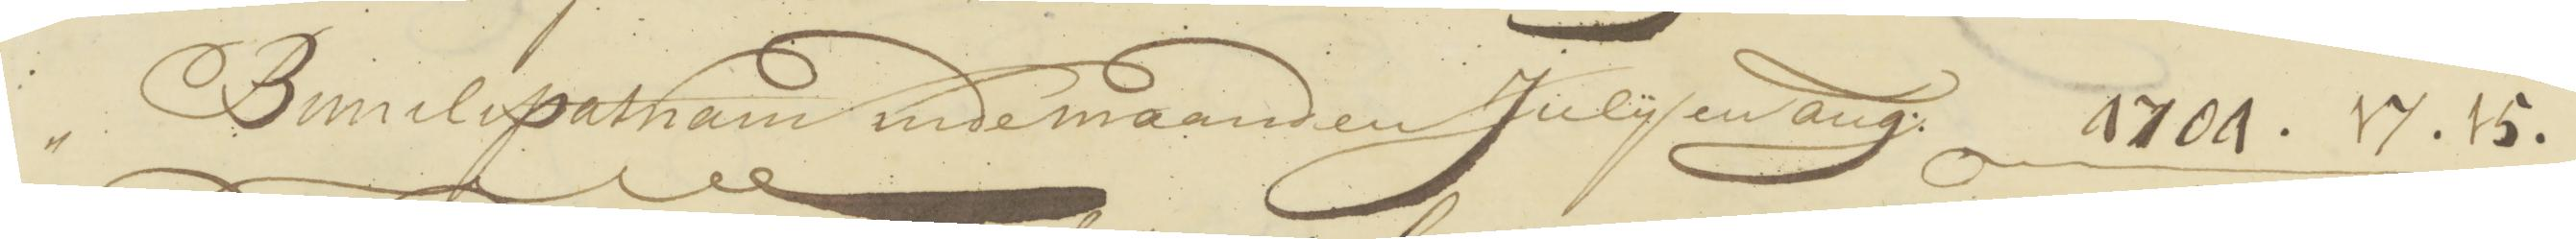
„ Bimilipatnam in de maanden Julij en aug: 4704. 17.15.
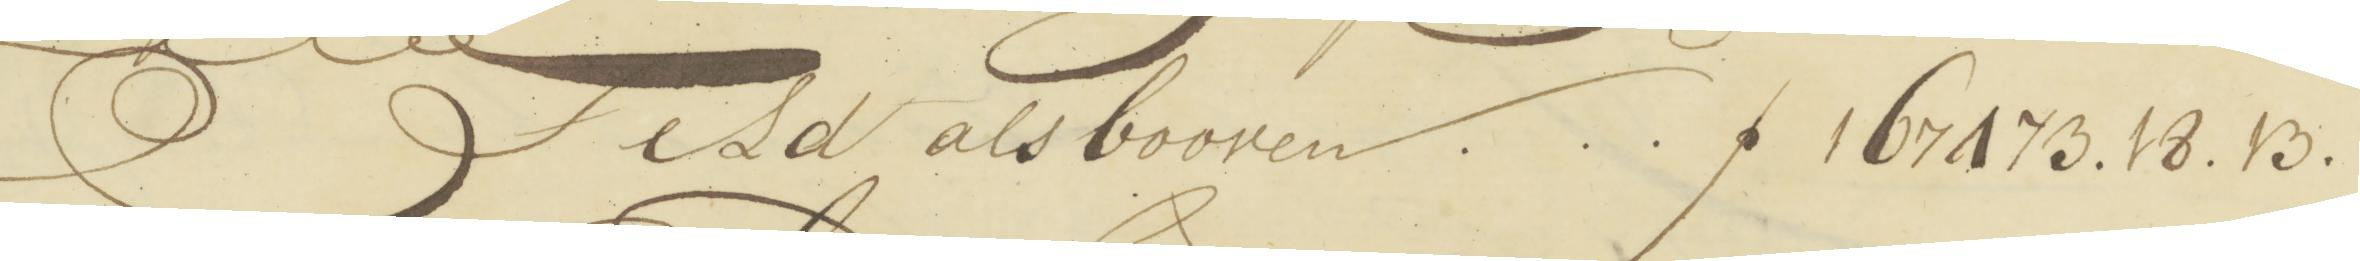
Teld als booven . . . ƒ 167473.18.13.
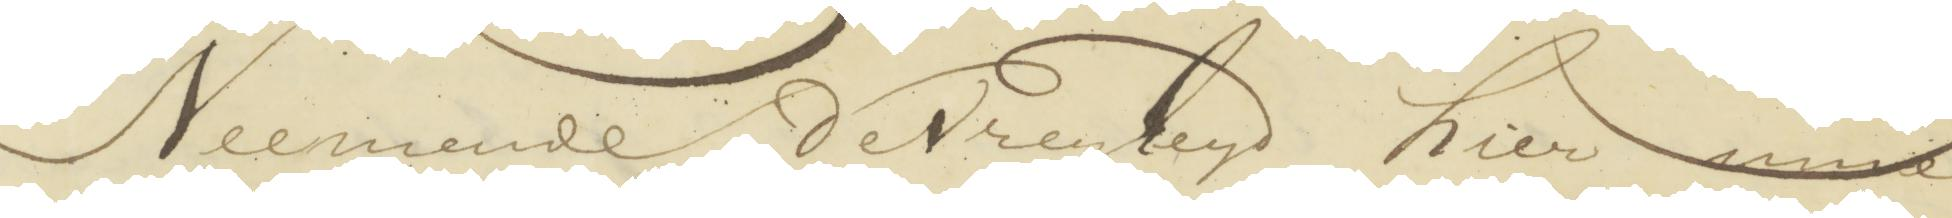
Neemende de vreyheyd hier inne
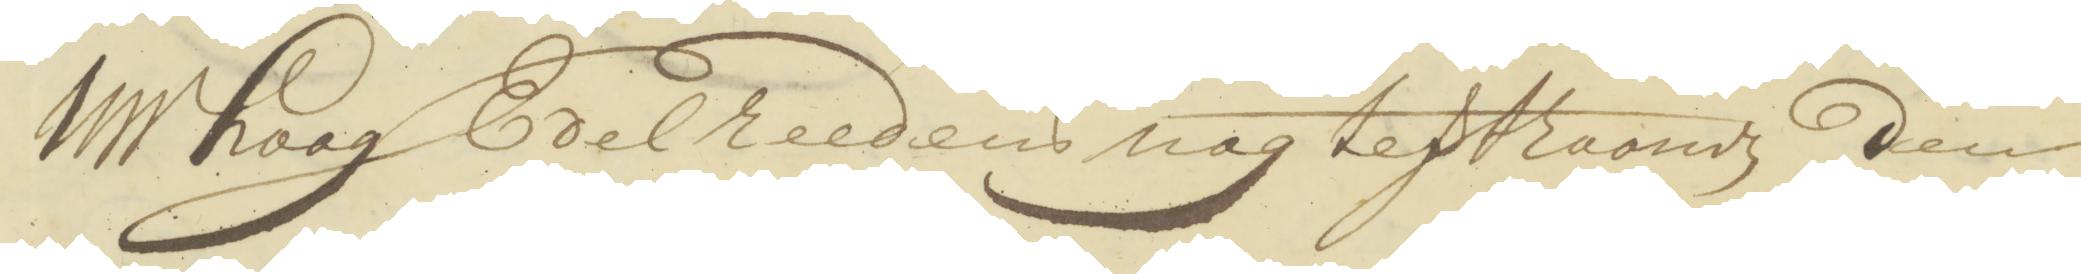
UW hoog Edelheedens nog te verthoonen den
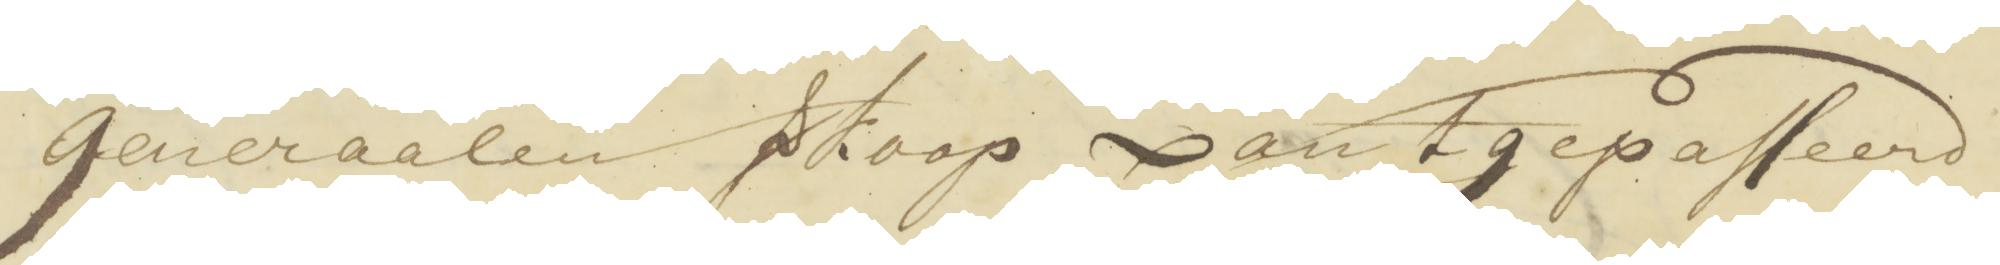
generaalen verkoop van t gepasseerd
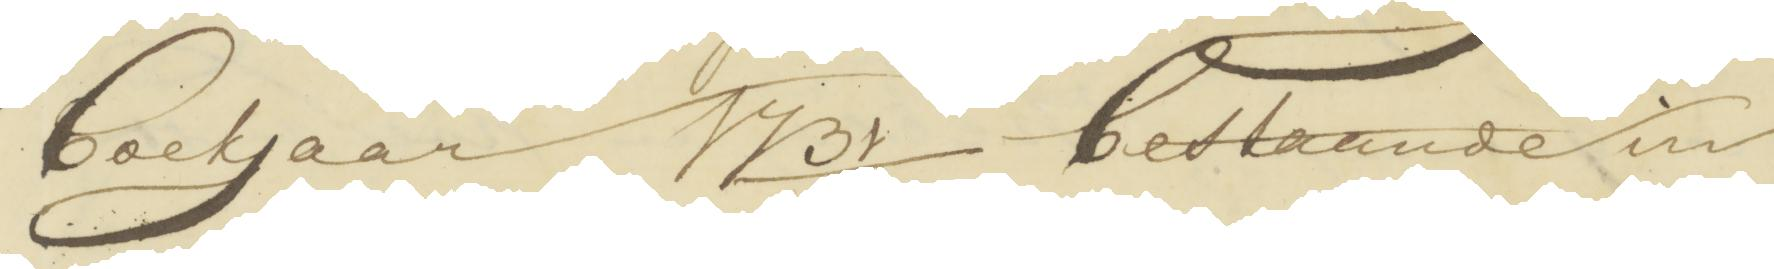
boekjaar 1731/32. bestaande in
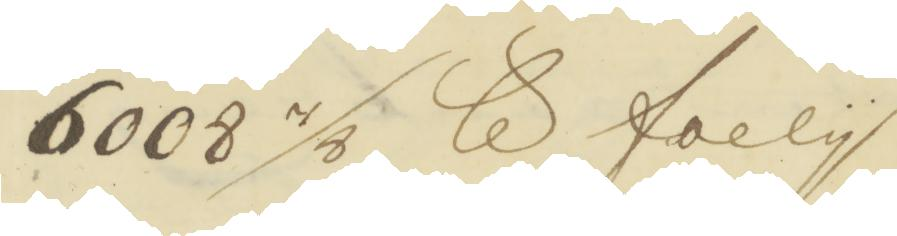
6008 7/8 lb foelij
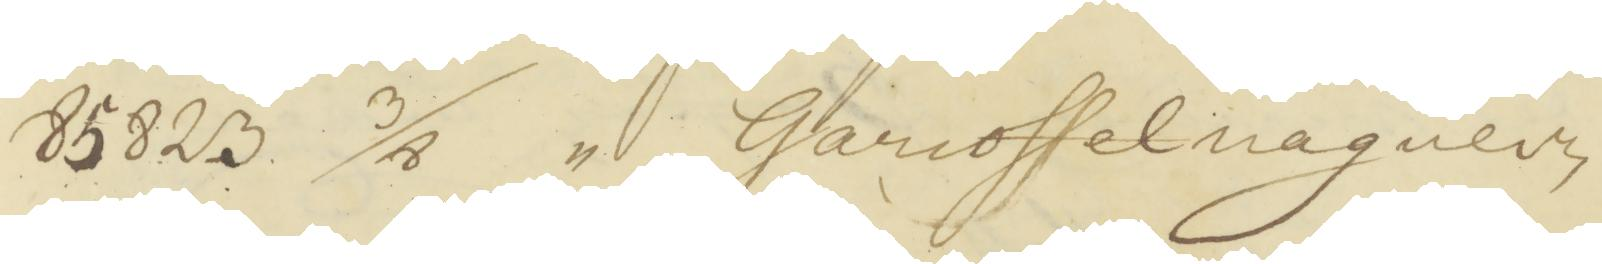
85823 3/8 „ Garioffel nagulen
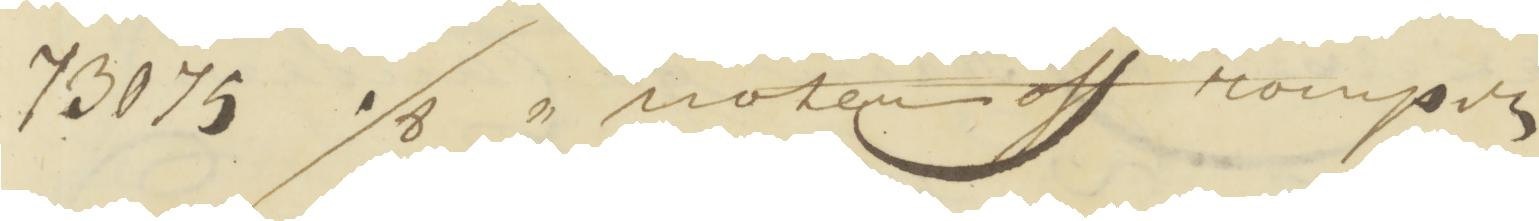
73075 1/8 „ noten off rompen
